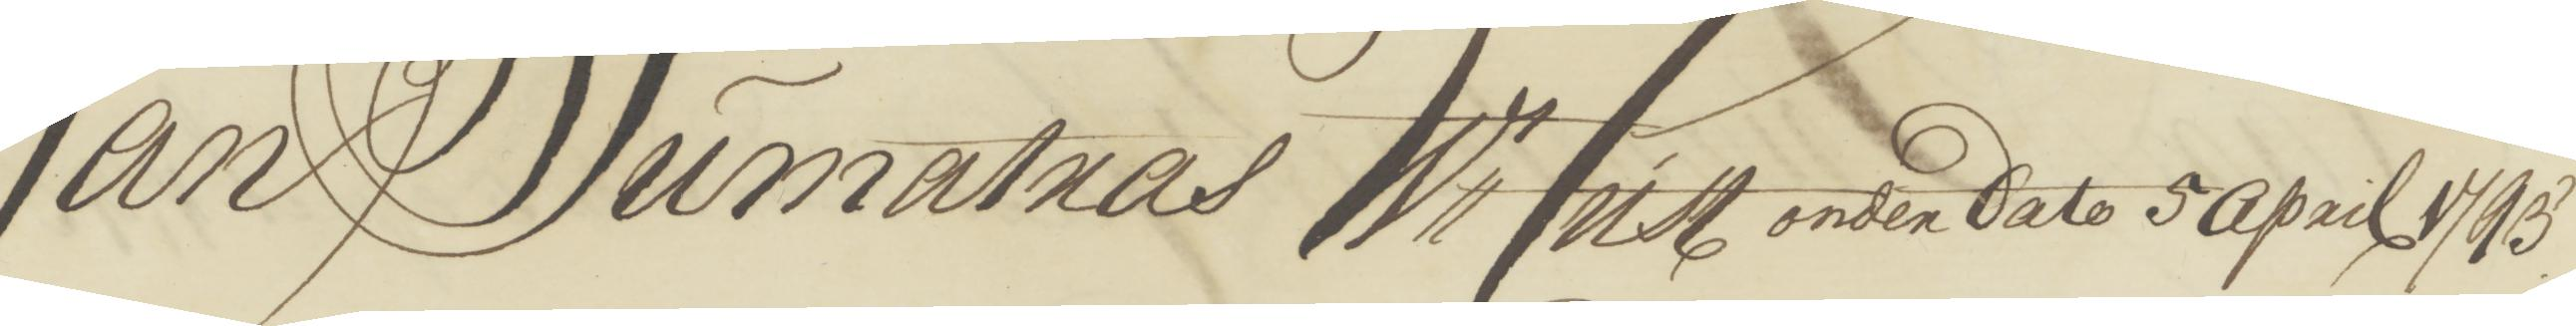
Van Sumatras W„t Cust onder dato 5 april 1743'.
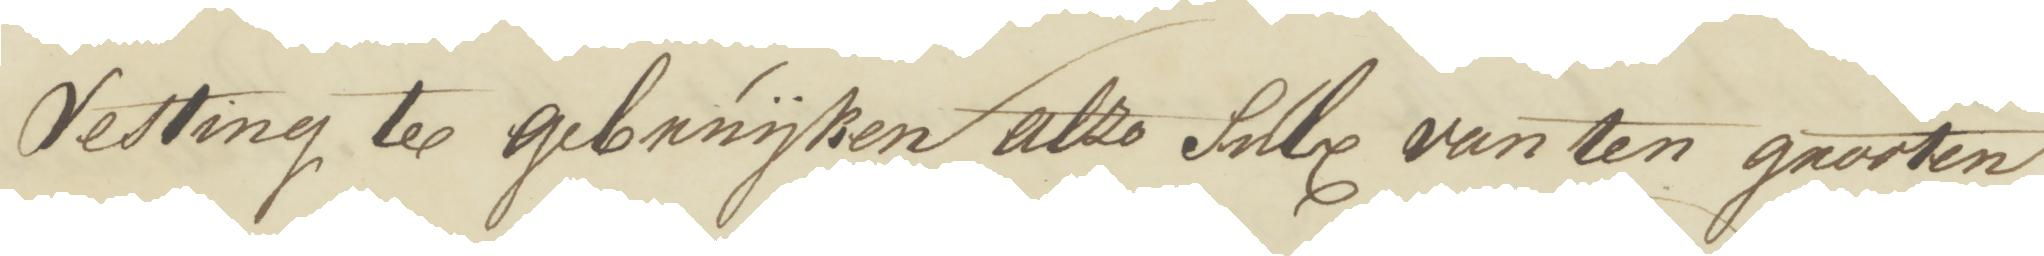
Vesting te gebruijken alzo sulx van ten grooten
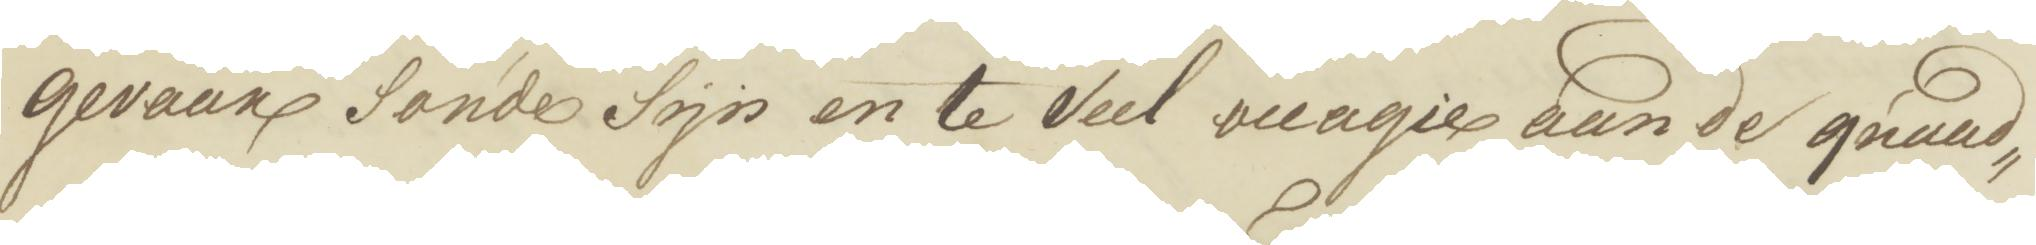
gevaar soude sijn en te veel occagie aan de quaad„
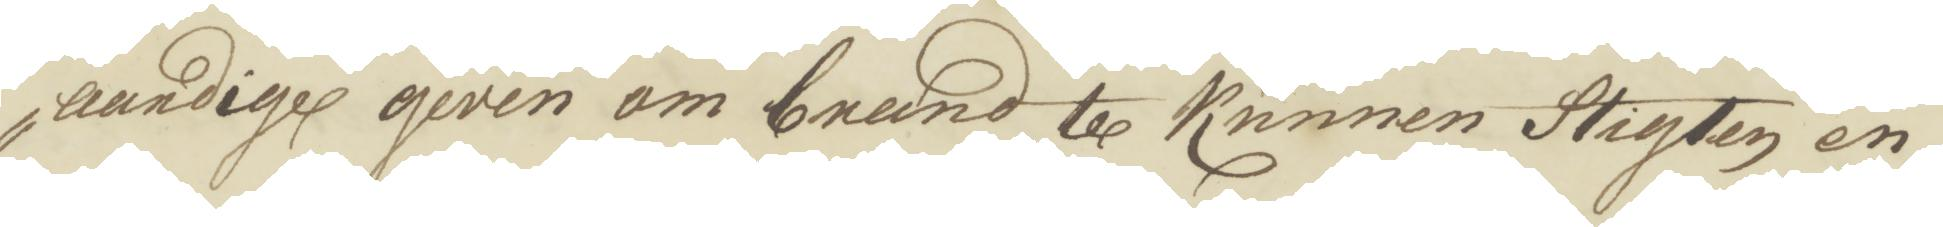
„aardige geven om brand te kunnen stigten en
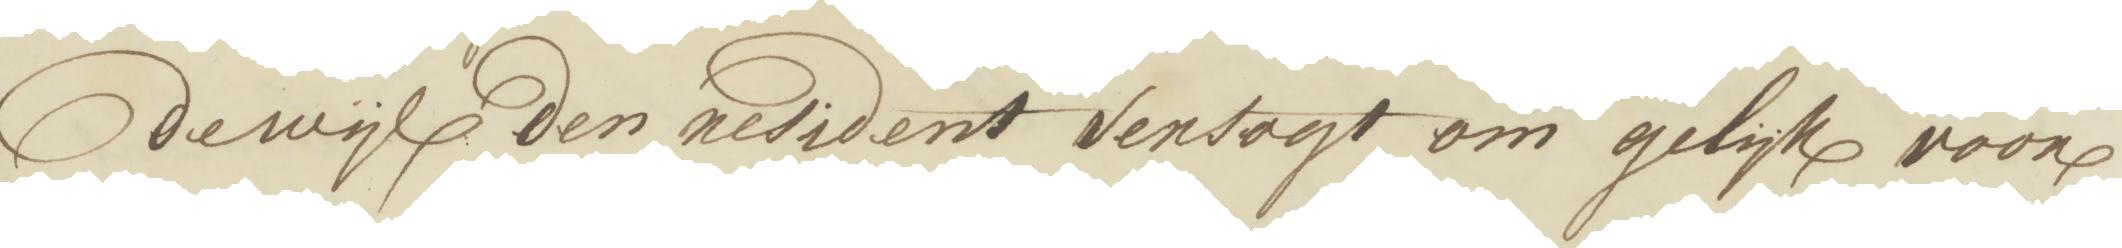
dewijl den resident versogt om gelijk voor
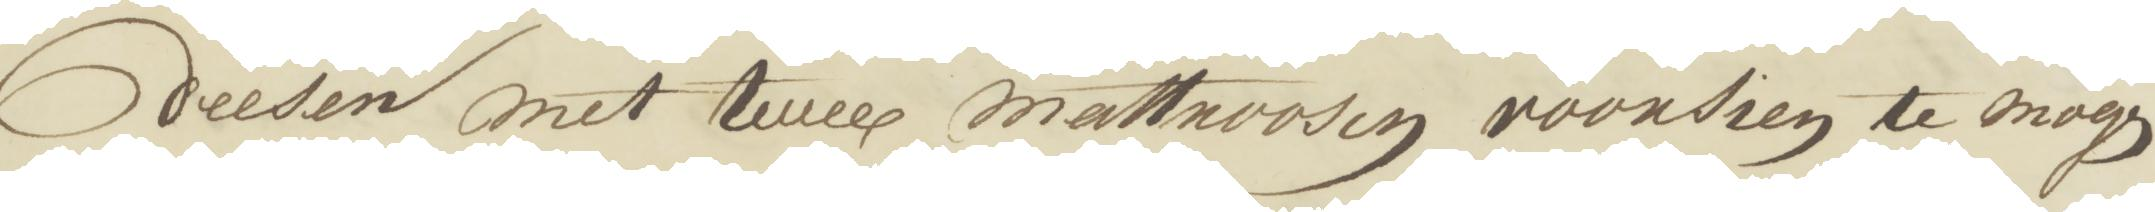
deesen met twee mattroosen voorsien te mogen
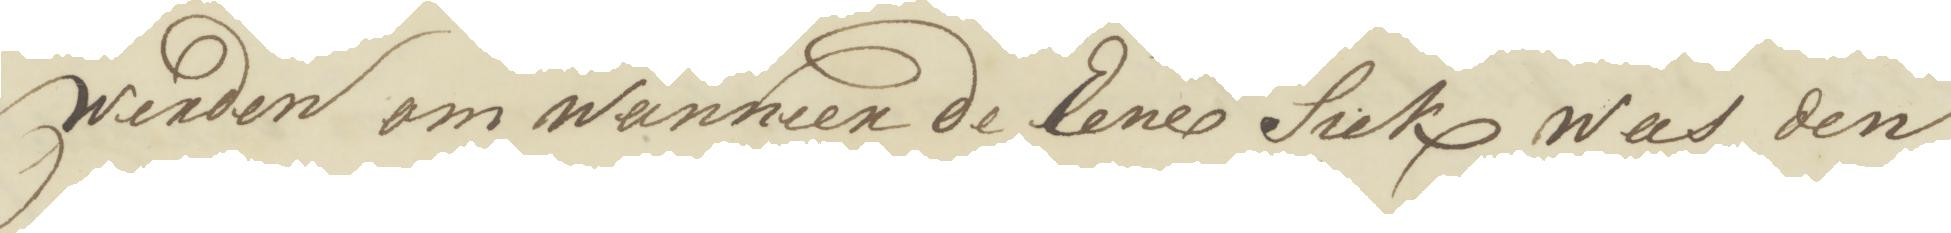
werden om wanneer de Eenes siek was den
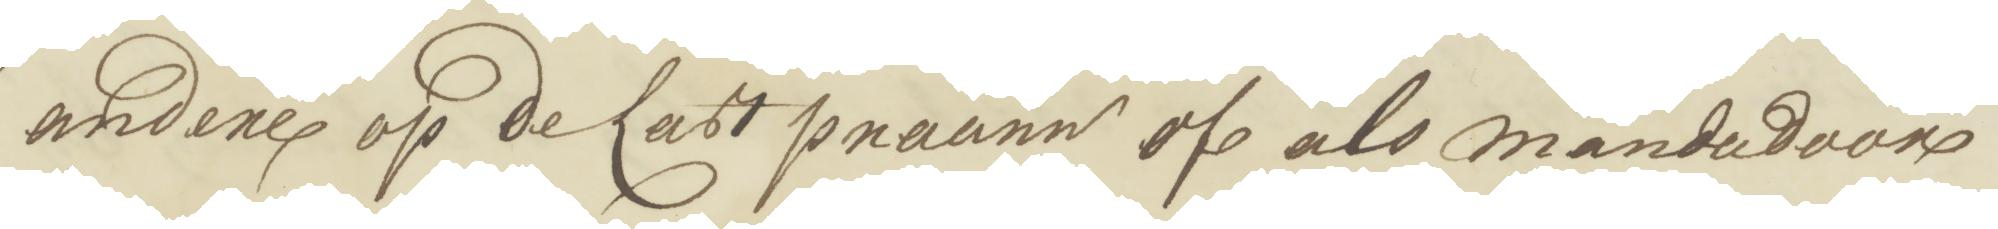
andere op de last praauw of als mandadoor
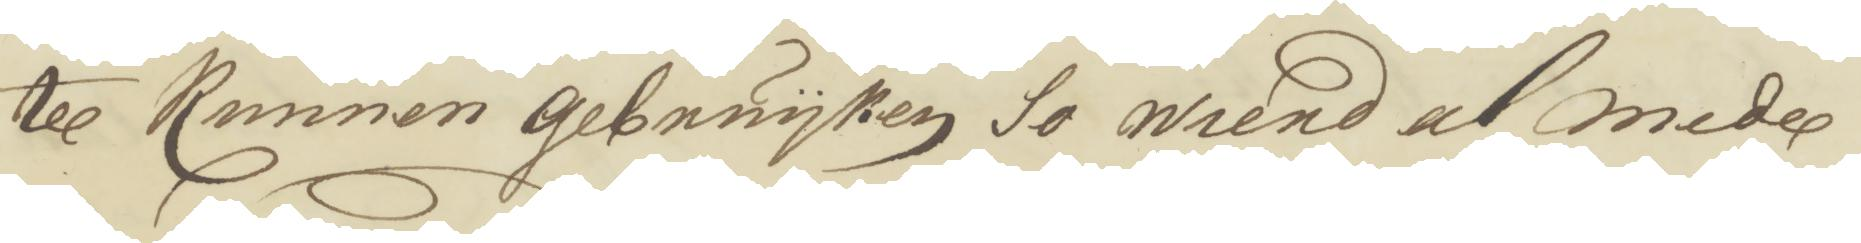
te kunnen gebruijken so wierd al mede
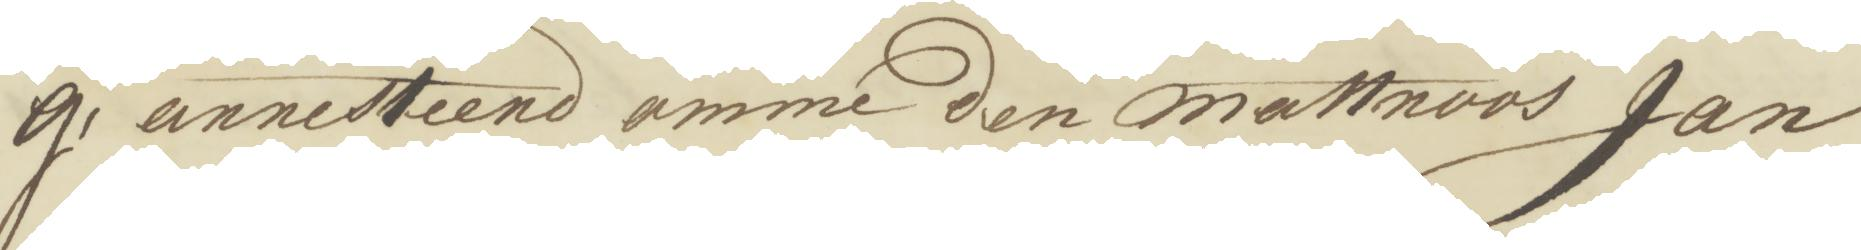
g' arresteerd omme den mattroos Jan
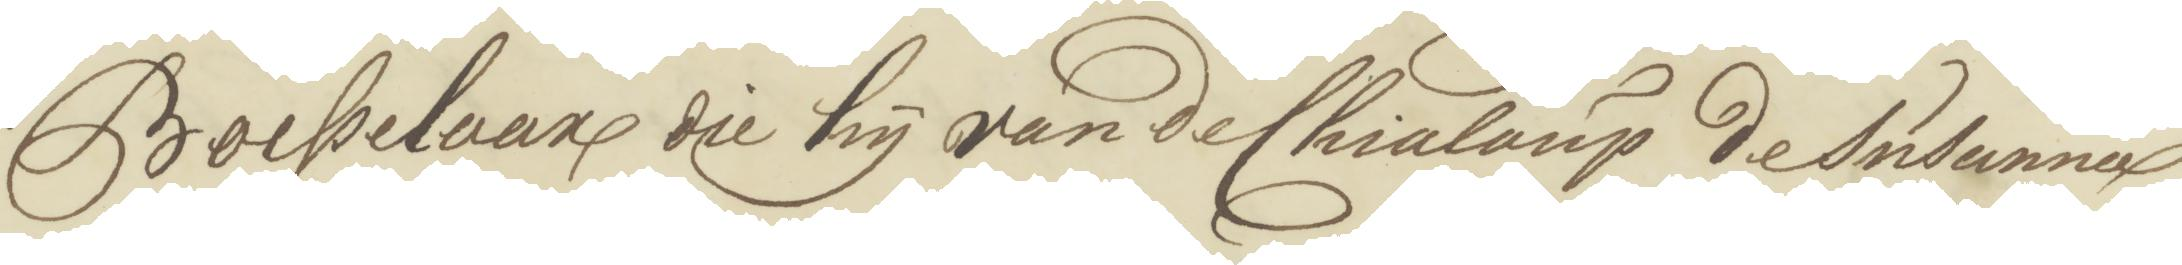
Boesselaar die hij van de Chialoup de susanna
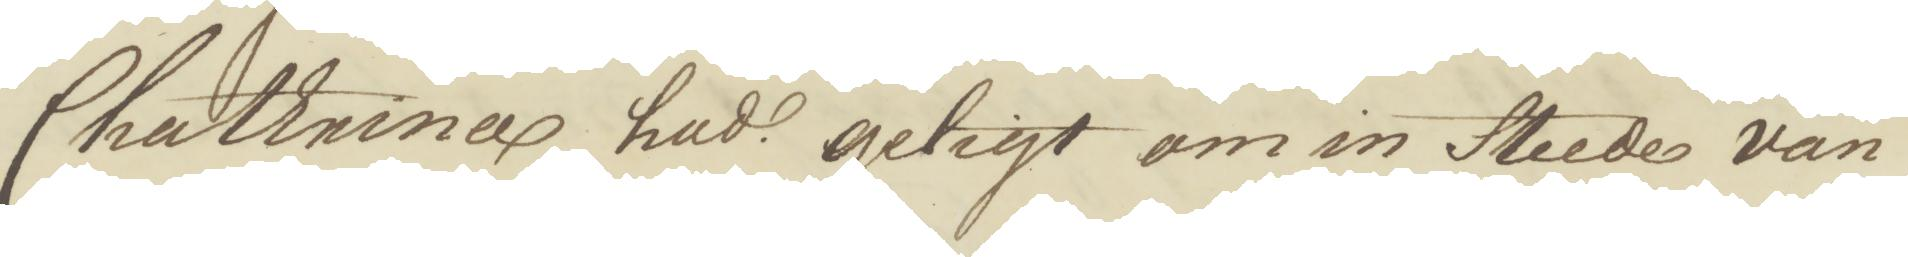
Chathrina had. geligt om in steede van
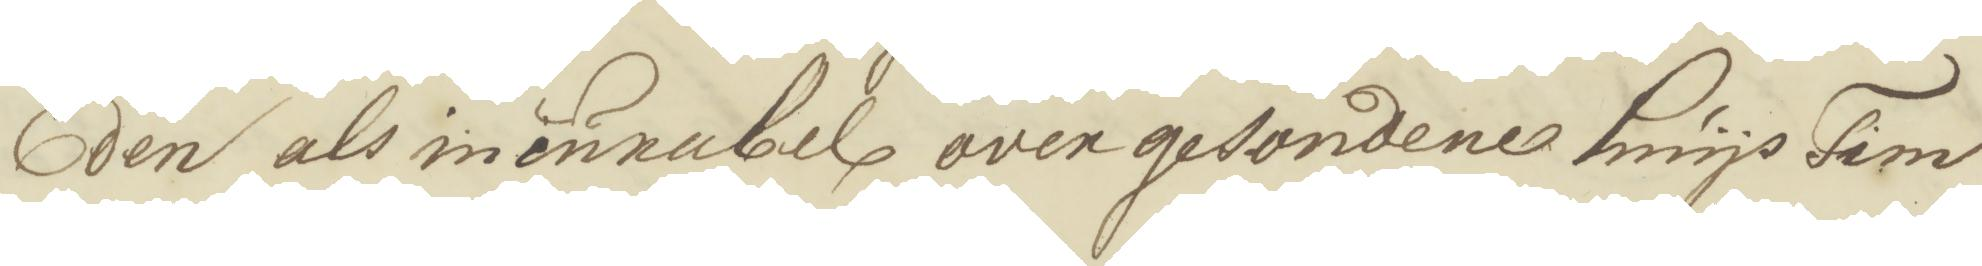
den als in curabel over gesondene huijs Tim
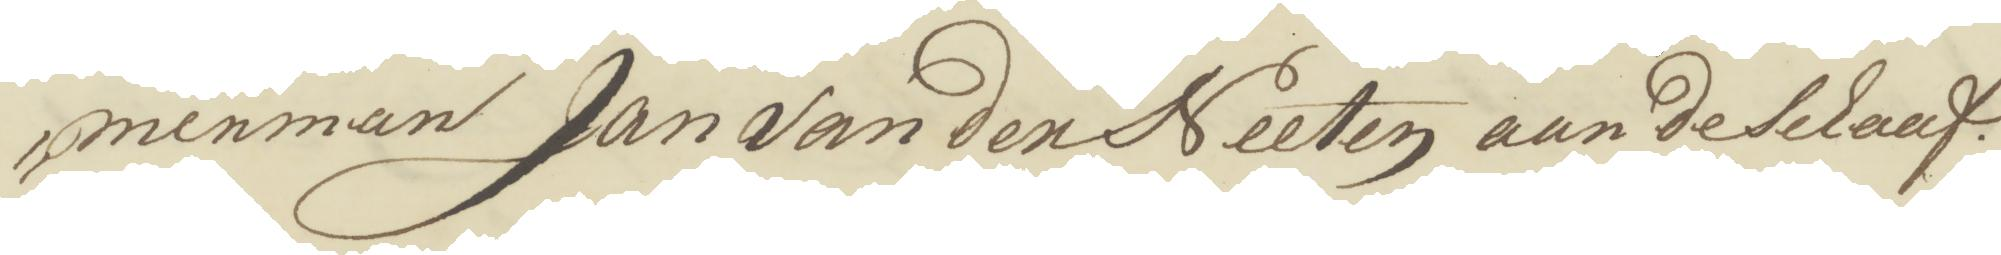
„merman Jan van der Neeten aan de schaaf.
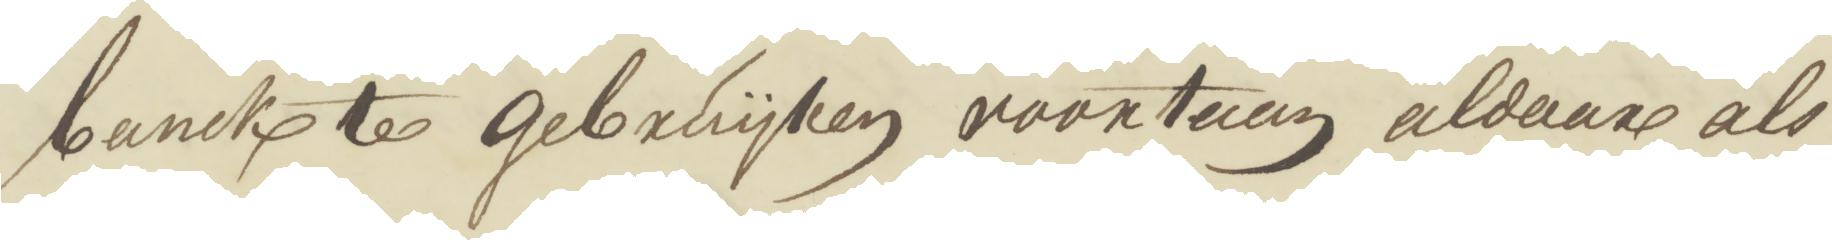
banck te gebruijken voortaan aldaar als
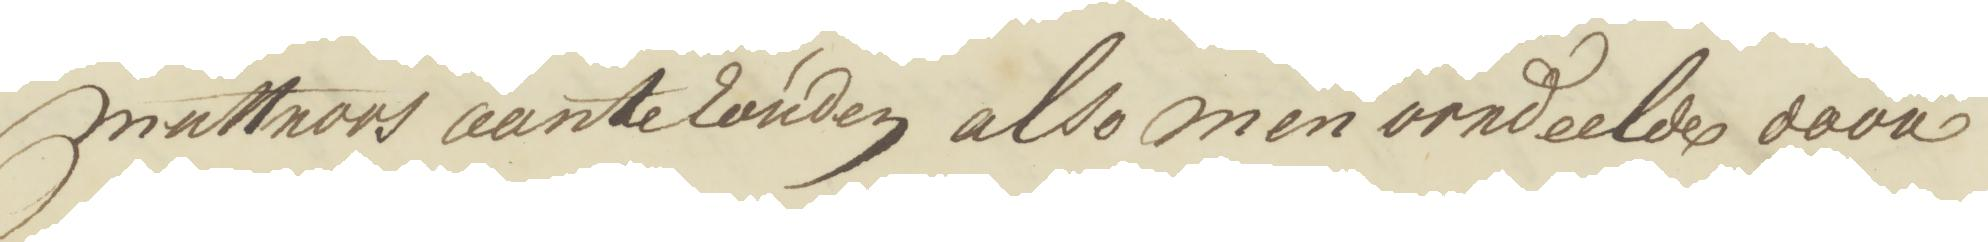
mattroos aan te houden also men oordeelde door
